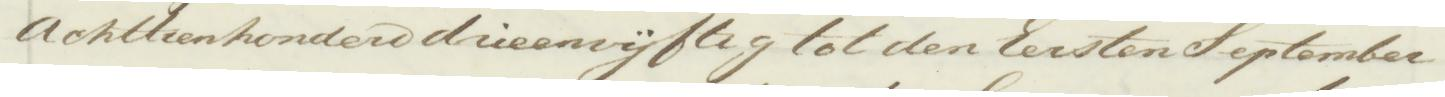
Achttienhonderd drieenvijftig tot den Eersten September
